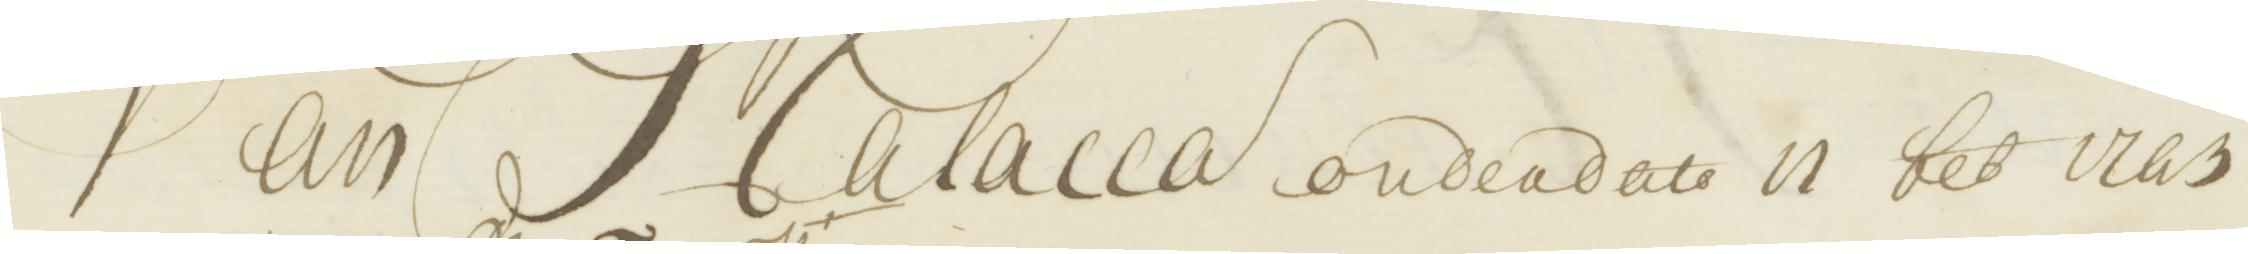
Van Malacca onder dato 11 feb 1743
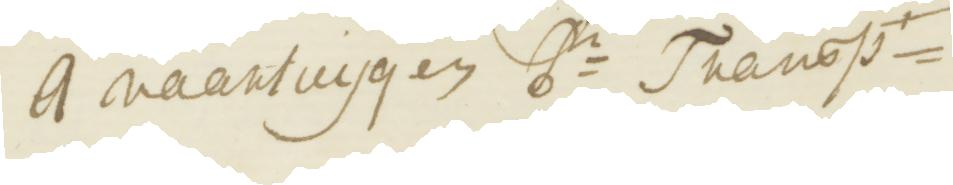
4 vaartuijgen P=r Transp=t
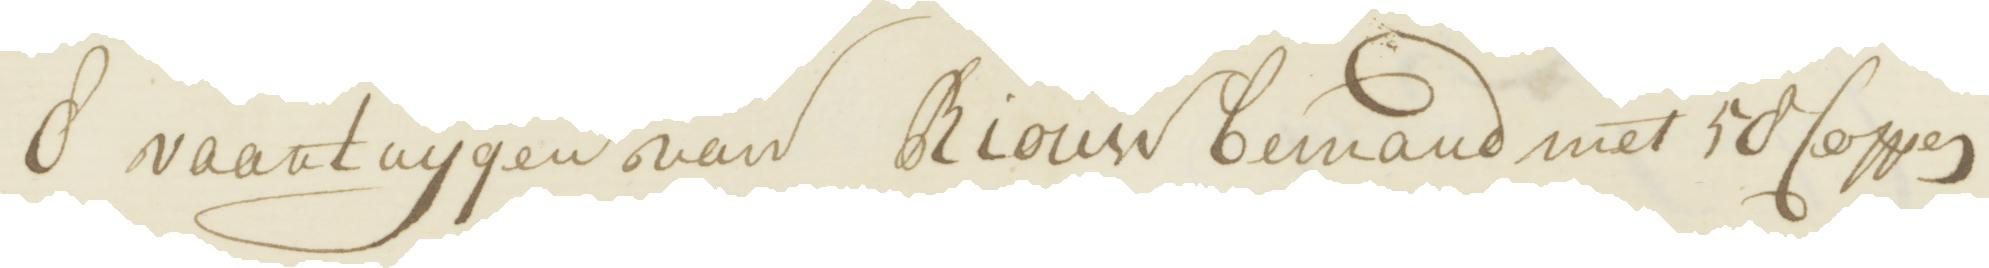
8 vaartuijgen van Riouw bemand met 58 Coppen
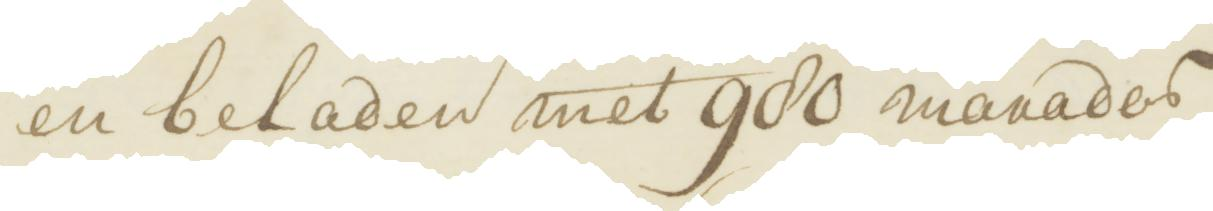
en beladen met 980 marades
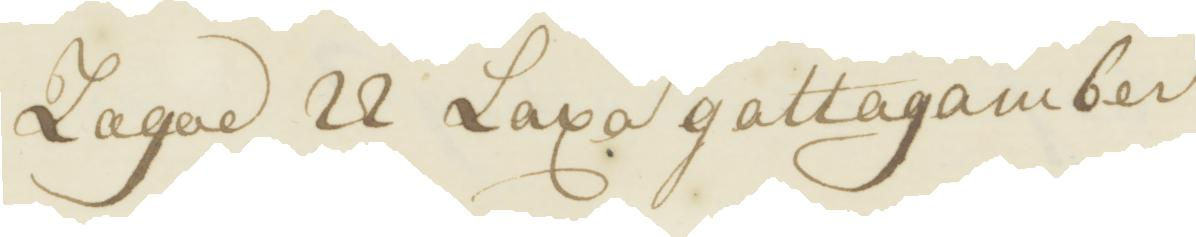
Zagoe 22 Laxa gattagamber
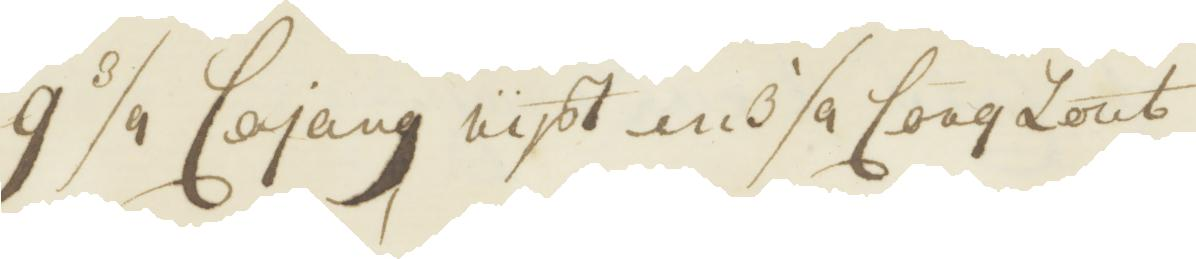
9¾ Cajang rijst en 3 1/4 Corq zout
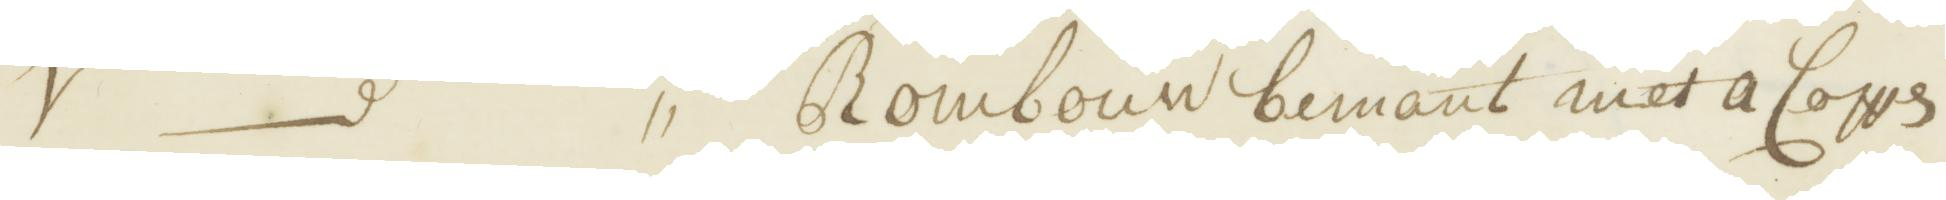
1 _o „ Rombour bemant met 4 coppen
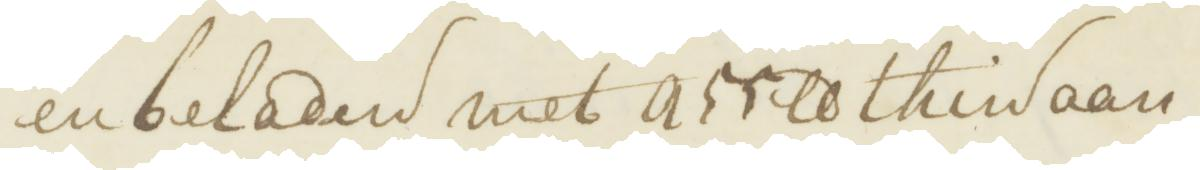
en beladen met 445 lb thin aan
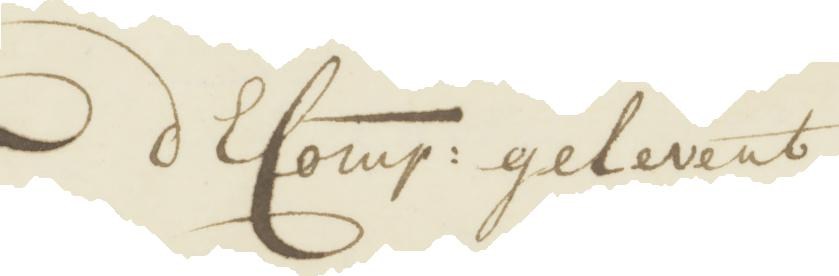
d E Comp: gelevert
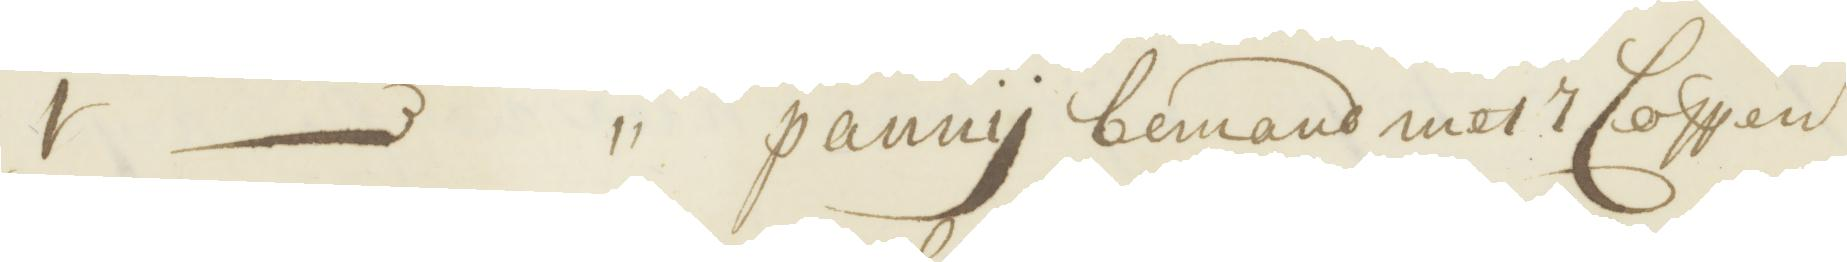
1 _o „ pannij bemand met 7 Coppen
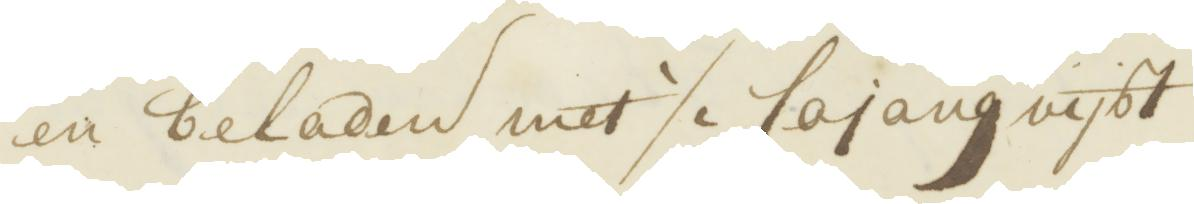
en beladen met ½ Cajang rijst
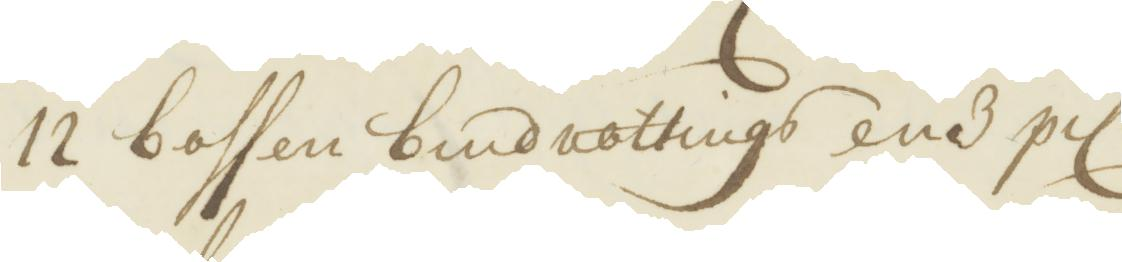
12 bossen bindrottings en 3 pic
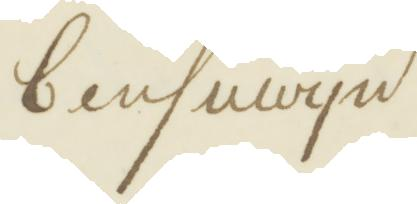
bensuwijn
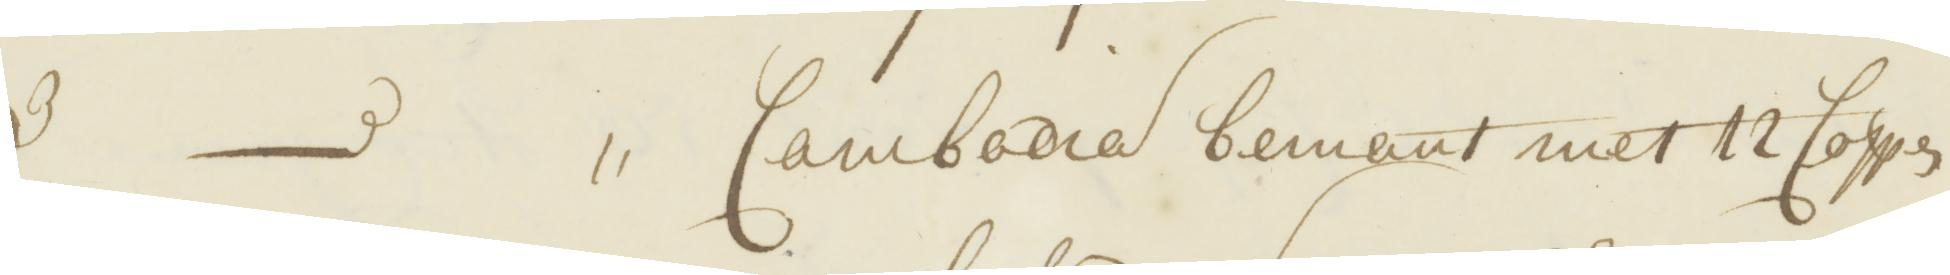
3 _o „ Cambodia bemant met 12 Coppen
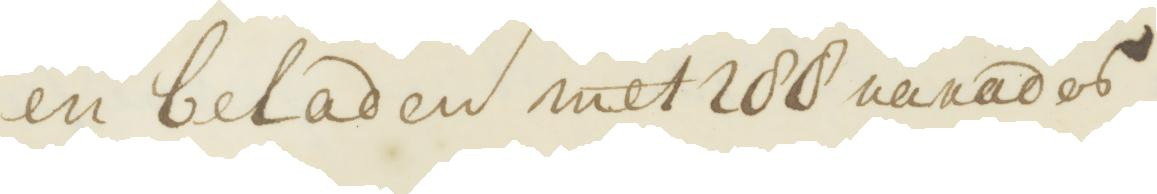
en beladen met 288 rarades
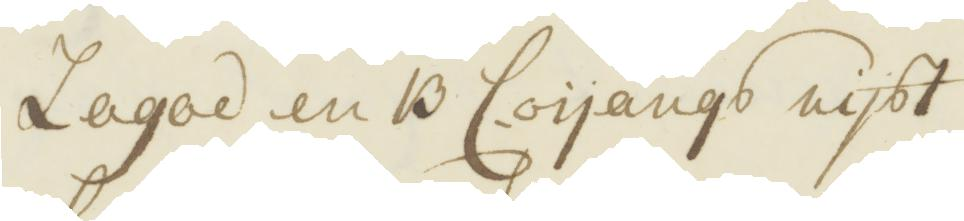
Zagoe en 13 Coijangs rijst
